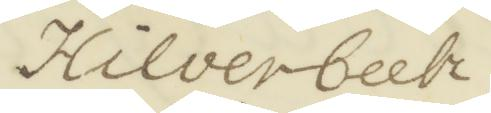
Hilverbeek
